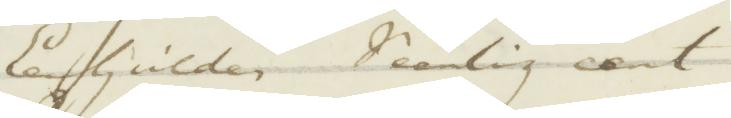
Een Gulden Veertig cent
